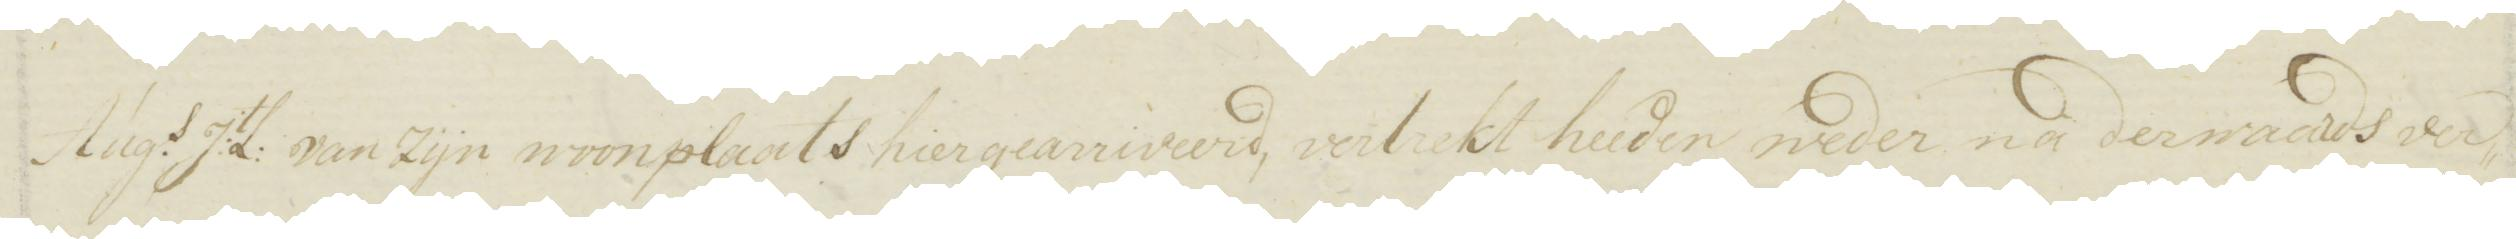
Aug:s J:tl: van zijn woonplaats hier gearriveerd, vertrekt heeden weder na derwaerds ver„
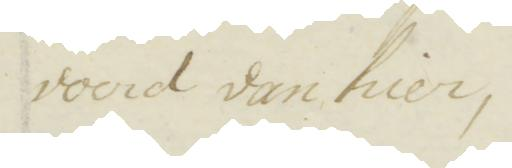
voerd van hier,
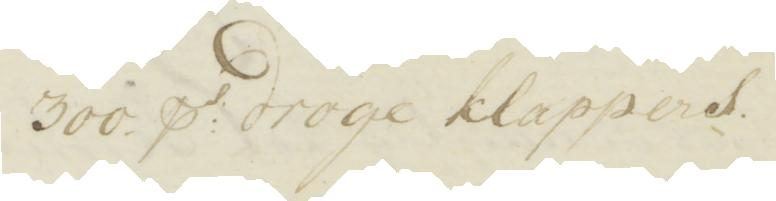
300. p:s droge klappers.
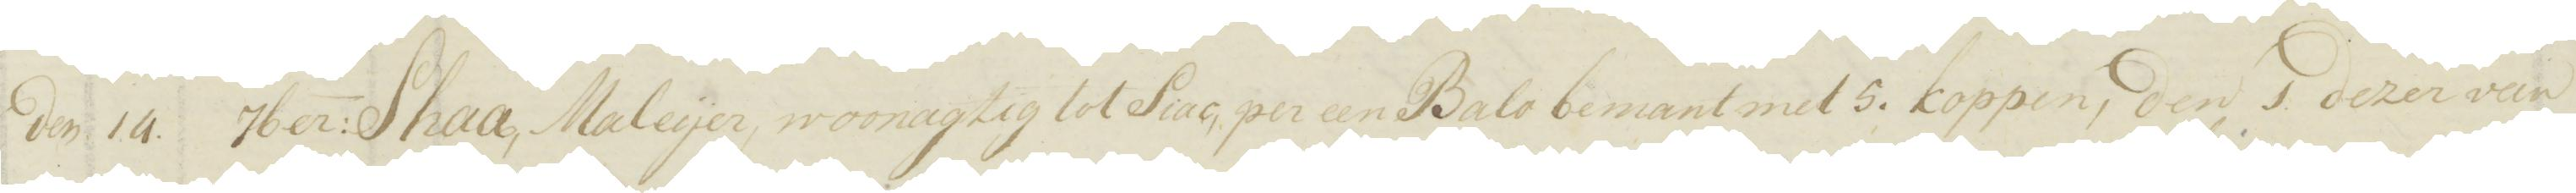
den 14. 7ber: Shaa, Maleijer, woonagtig tot Siac, per een Balo bemant met 5. koppen, den, 1. dezer van
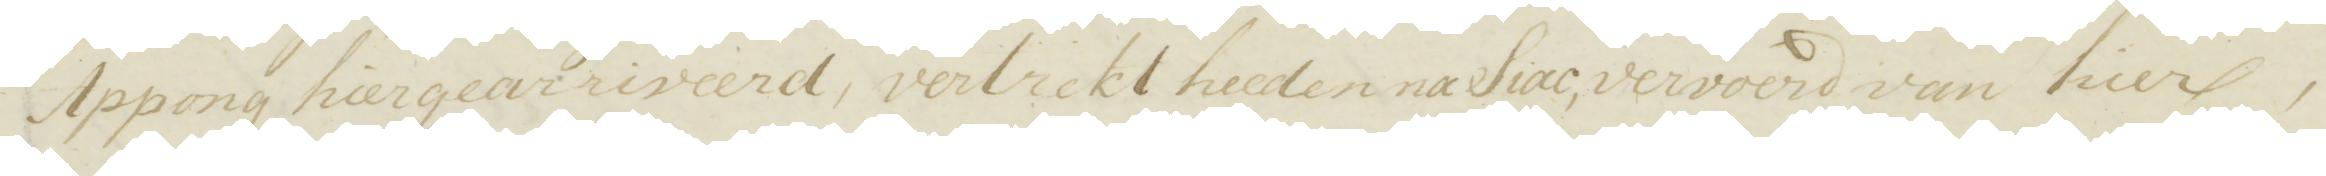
Appong hier gearriveerd, vertrekt heeden na Siac, vervoerd van hier,
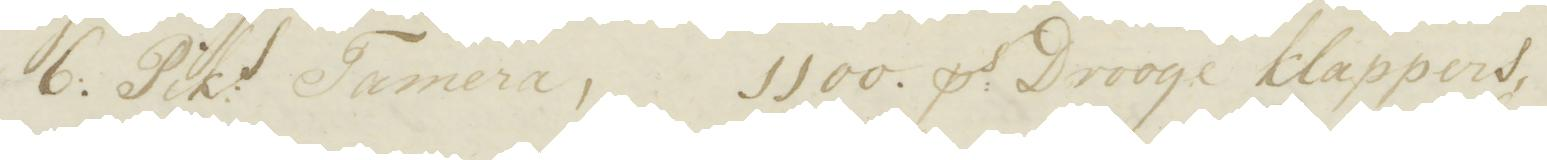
6. Pik:s Tamera, 1100. p.s Drooge klappers,
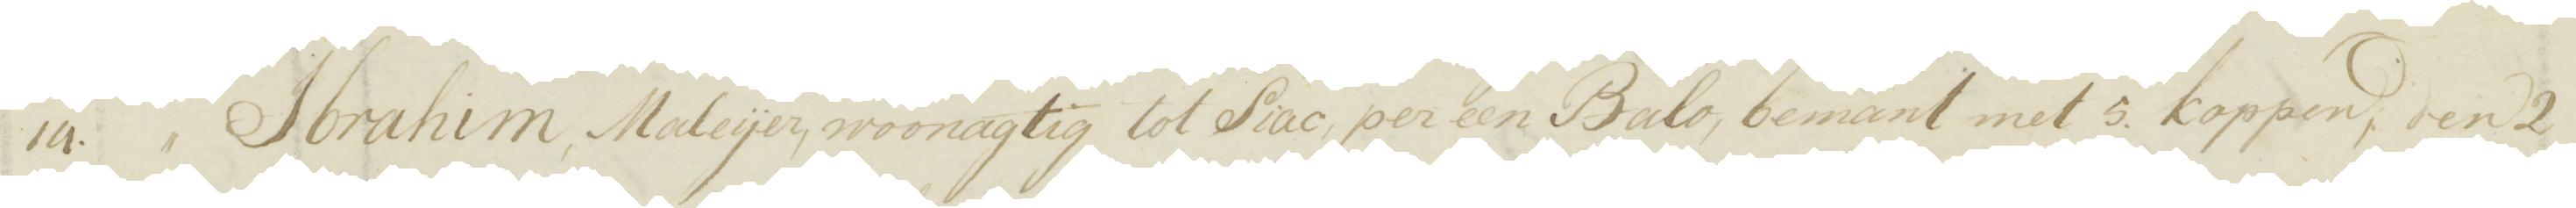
14: „ Ibrahim, Maleijer, woonagtig tot Siac, per een Balo, bemant met 5. koppen, den 2.
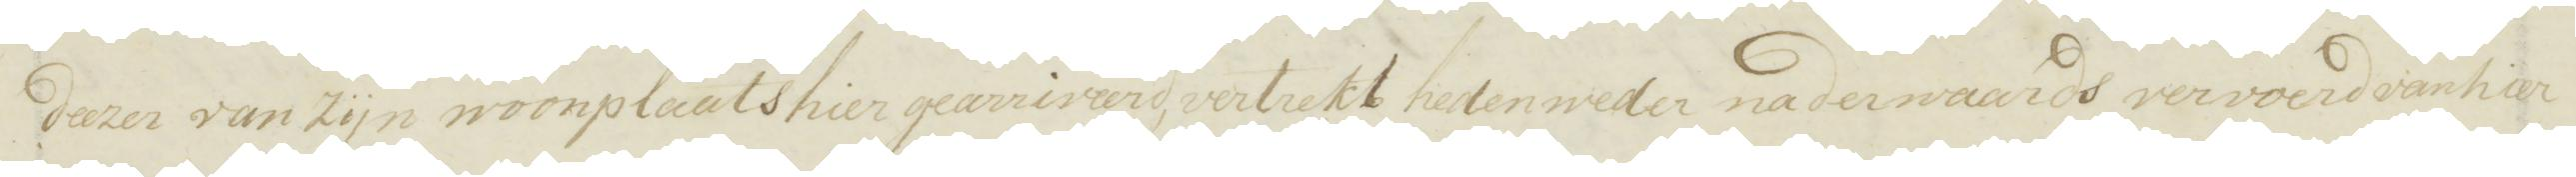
deezer van zijn woonplaats hier gearriveerd, vertrekt heten weder na derwaards vervoerd van hier
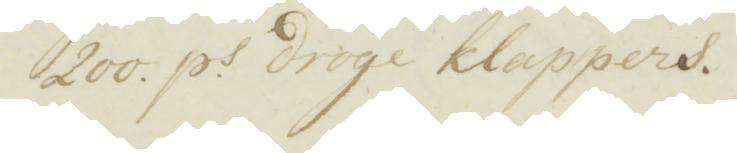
200. p.s droge klappers.
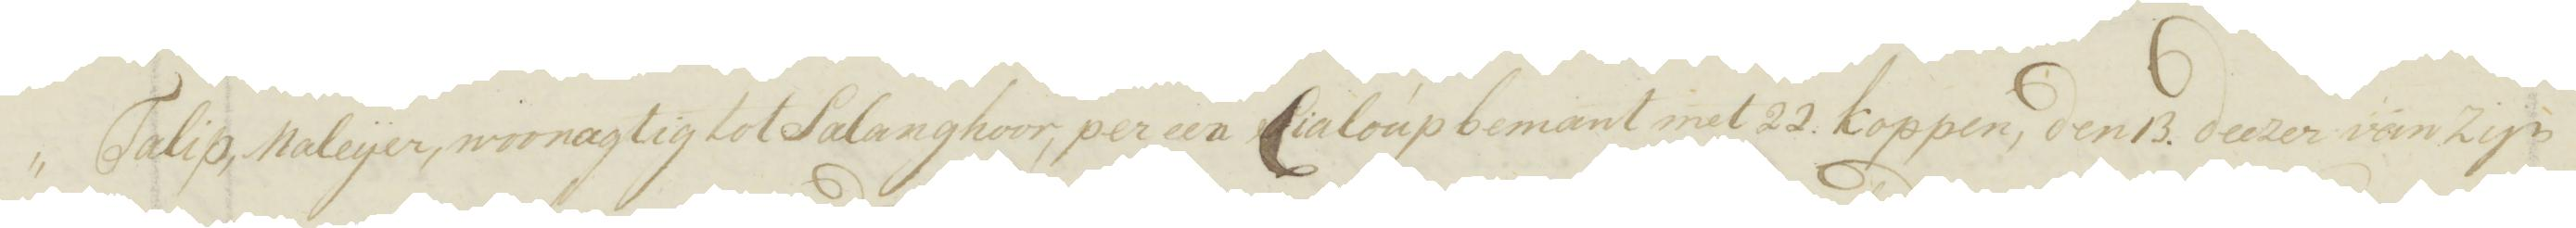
„ Talip, Maleijer, woonagtig tot Salanghoor, per een Cialoup bemant met 22. koppen, den 13. deezer van zijn
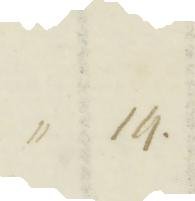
„ 14.
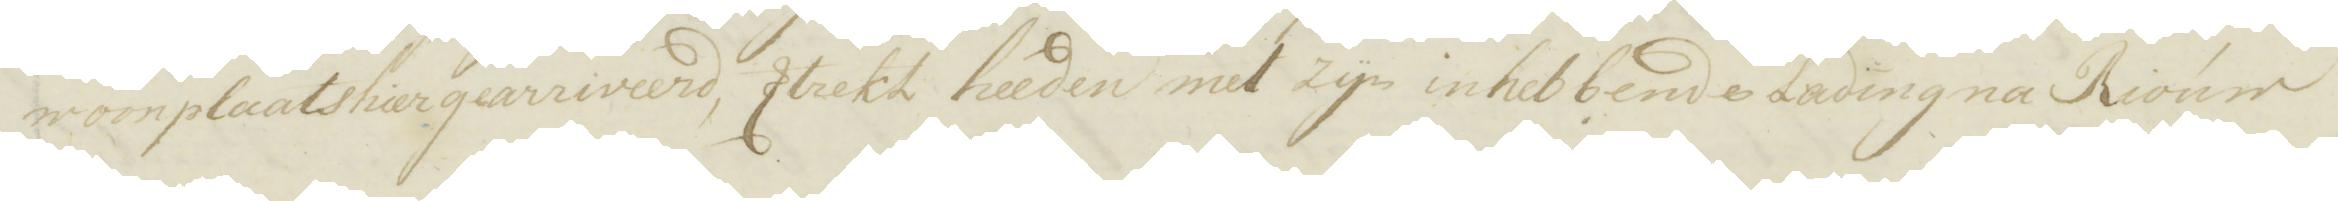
woonplaats hier gearriveerd, vertrekt heeden met zijn inhebbende lading na Riouw
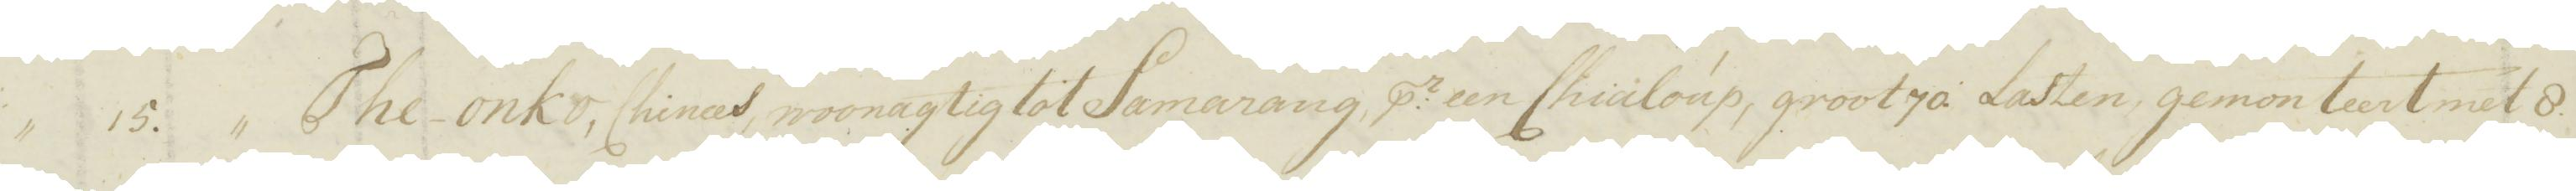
„ 15. „ The onko, Chinees, woonagtig tot Samarang, p:r een Chiiloup, groot 70 Lasten, gemonteert met 8.
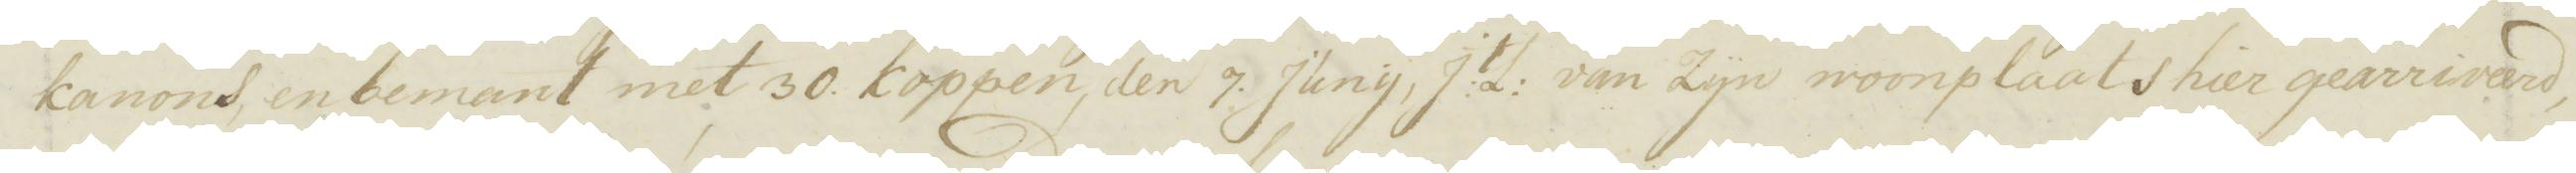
kanons, en bemant met 30. koppen, den 7. Junij, J:tl: van zijn woonplaats hier gearriveerd,
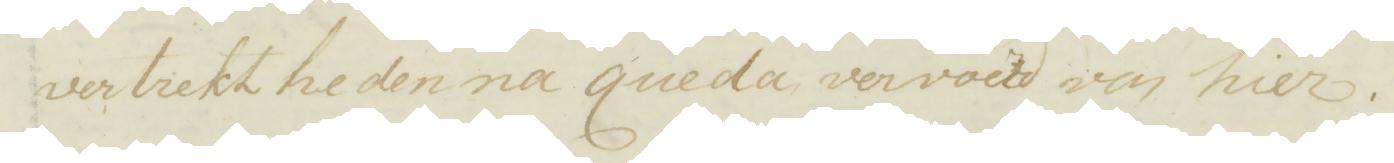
vertrekt heden na queda, vervoerd van hier.
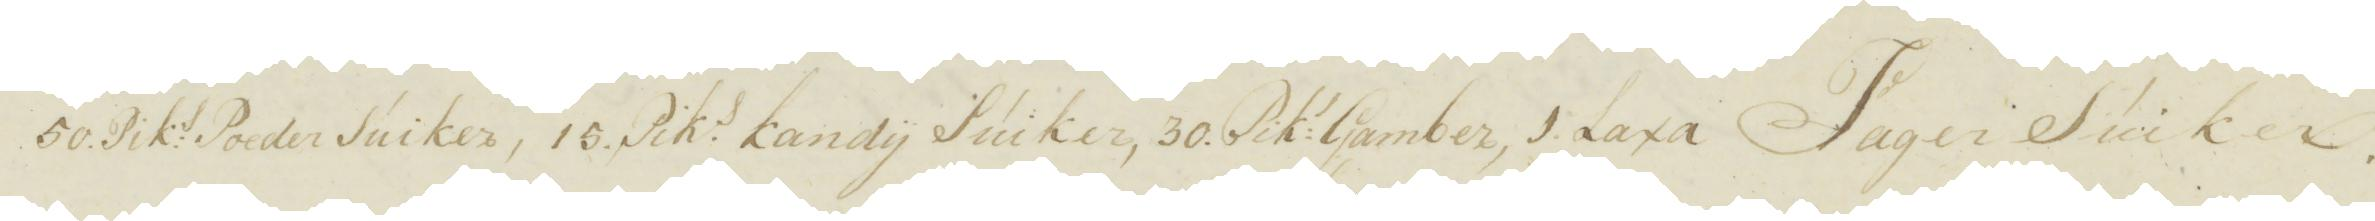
50. Pik:s Poeder suiker, 15. Pik=s kandij Suiker, 30. Pik:s Gamber, 1 Laxa Jager Suiker.
